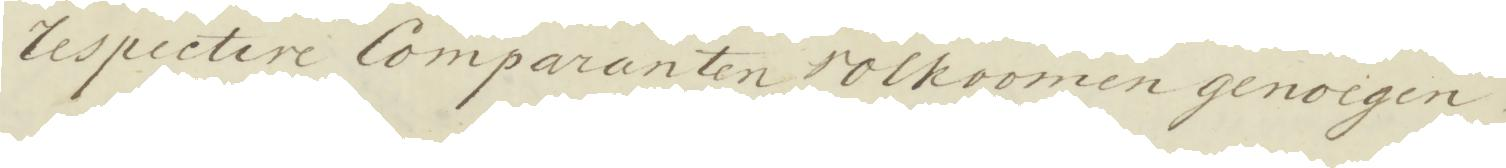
respective Comparanten volkoomen genoegen
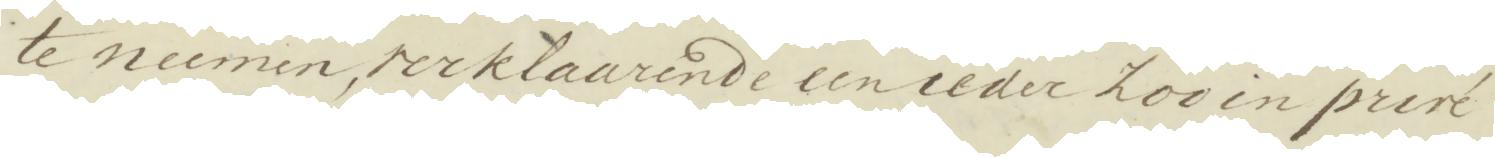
te neemen, verklaarende een ieder zoo in privé
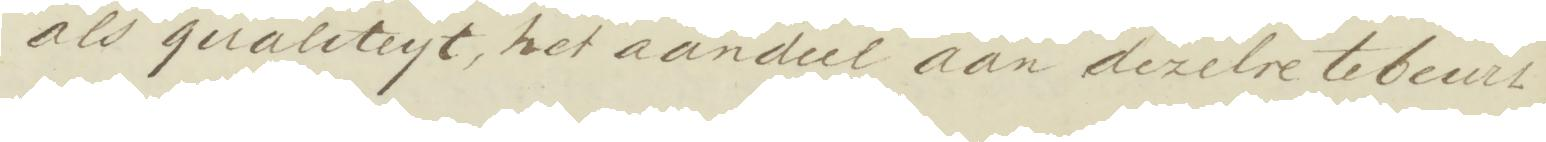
als qualiteijt, het aandeel aan dezelve te beurt
